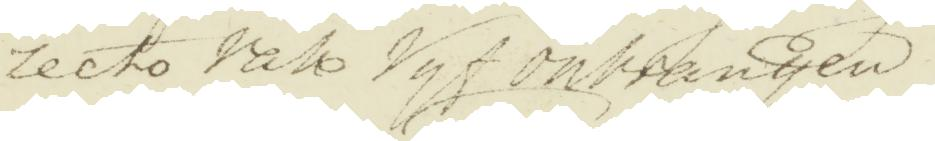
recto vak Vyf ontfangen
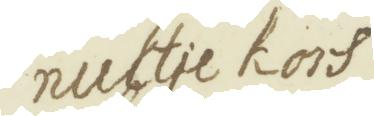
neeltje kors
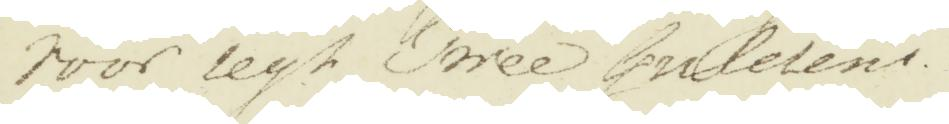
voor regt Twee Guldens.
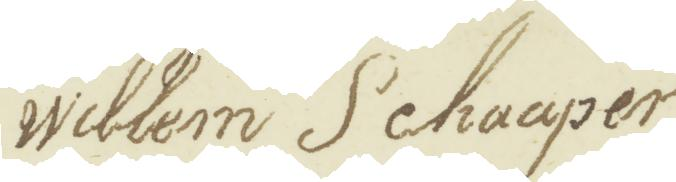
Willem Schaaper
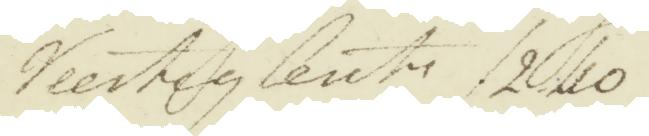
Veertig Cents ƒ2.40
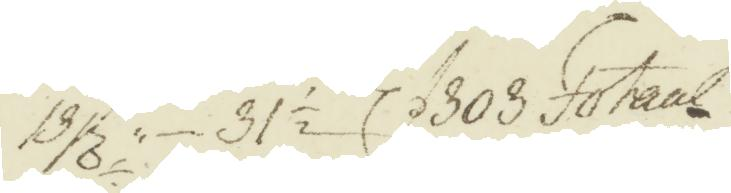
13/c=t „ — . 31½ ƒ303 Totaal
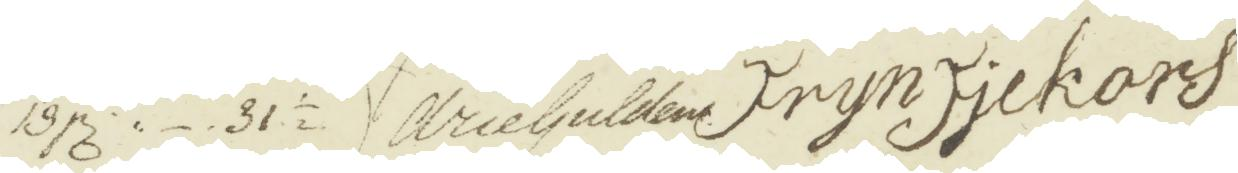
13/c=t „ —. 31½ drie Guldens Tryntjekors
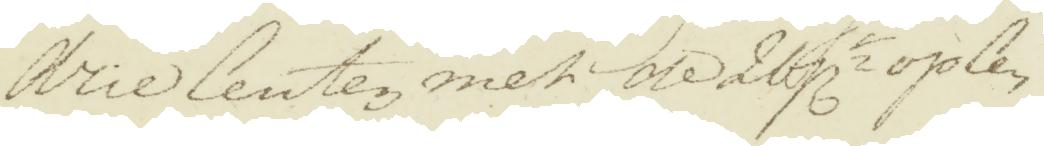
drie Centen met de 24/c=t opCen
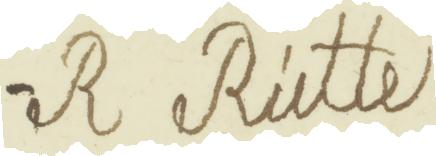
R Rutte
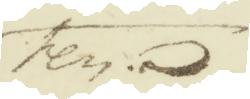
ten.—
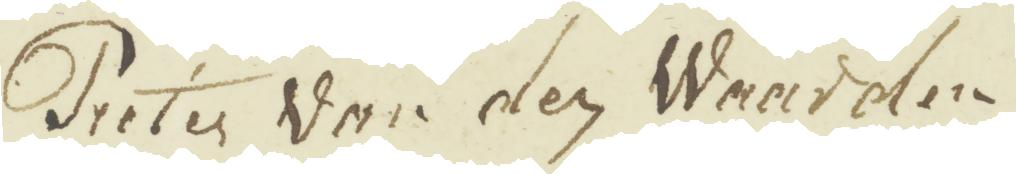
Pieter van den Waarden,
